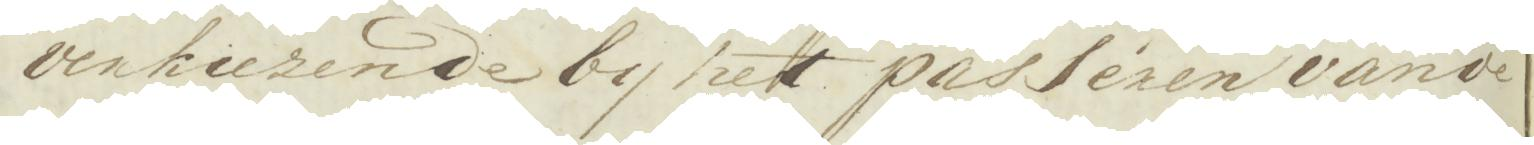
verkiezende by het passeren van de
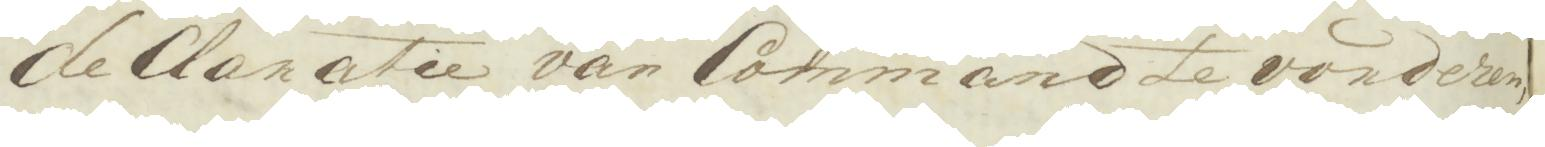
declaratie van Command te vorderen,
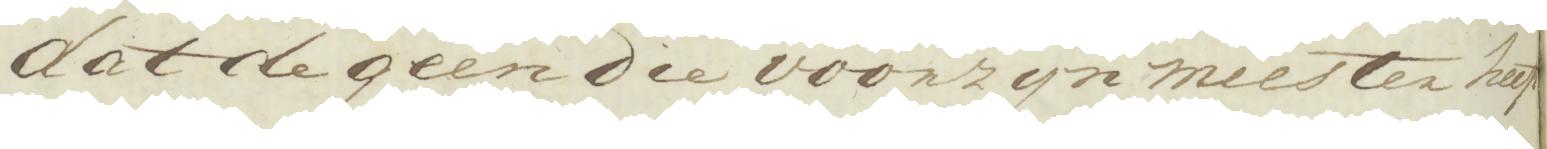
dat de geen die voorzyn meester heeft
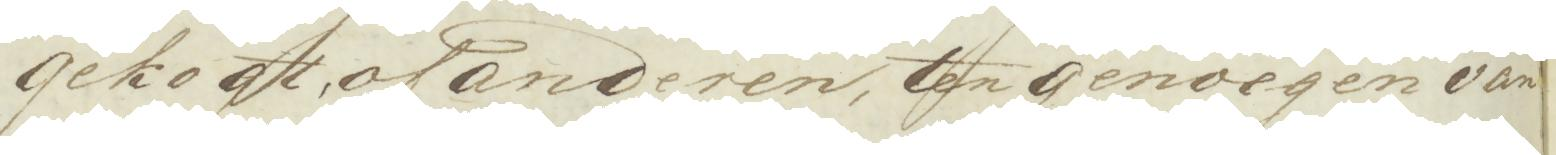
gekogt, of anderen, ten genoegen van
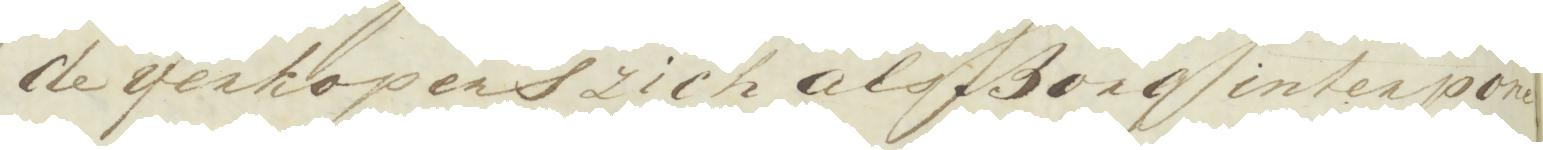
de verkopers zich als Borg interpone
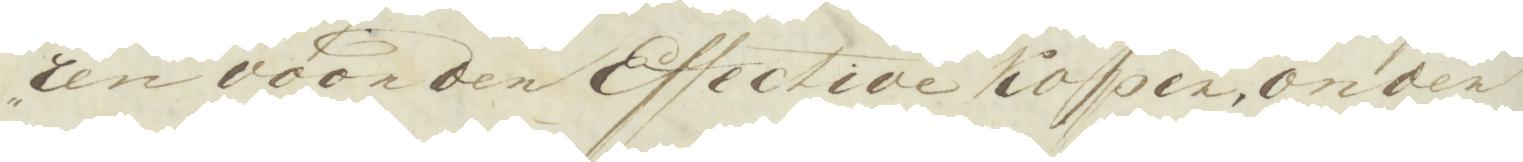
„ren voor den Effective Koper, onder
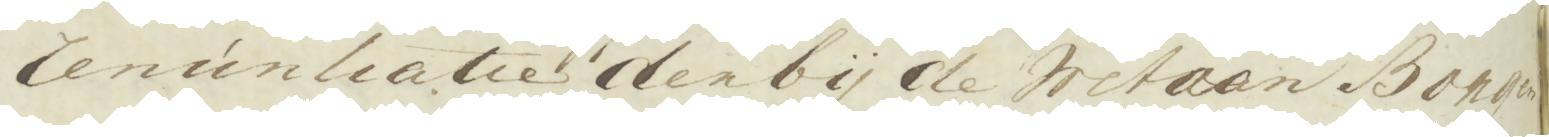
renuntiatie den bij de wet aan Borger
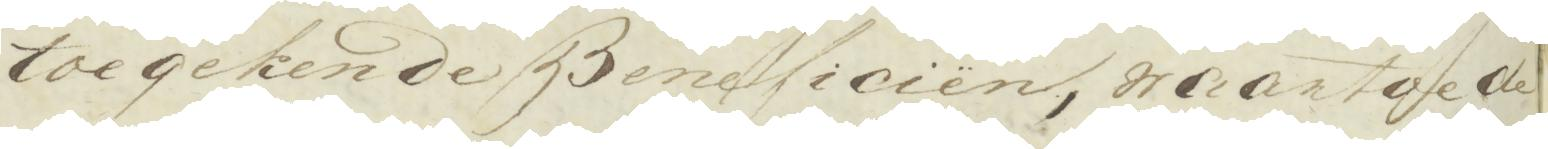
toe gekende Beneficiën, waar toe de
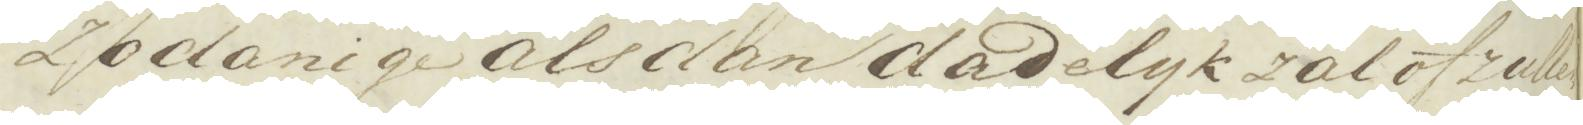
zodanige als dan dadelyk zal of zullen
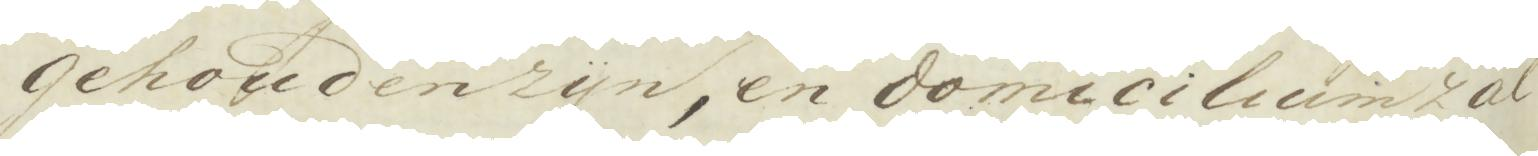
gehouden zijn, en domicilium zal
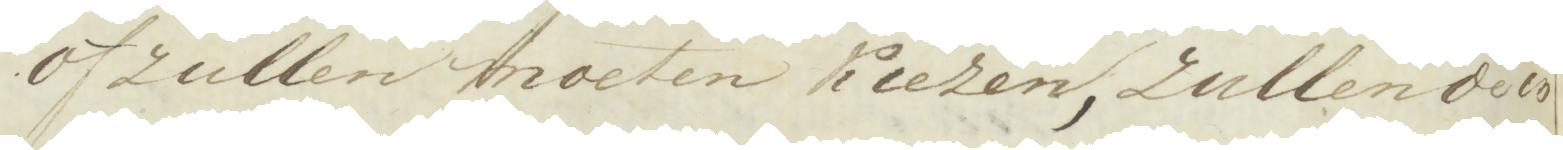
of zullen moeten kiezen, zullen de in
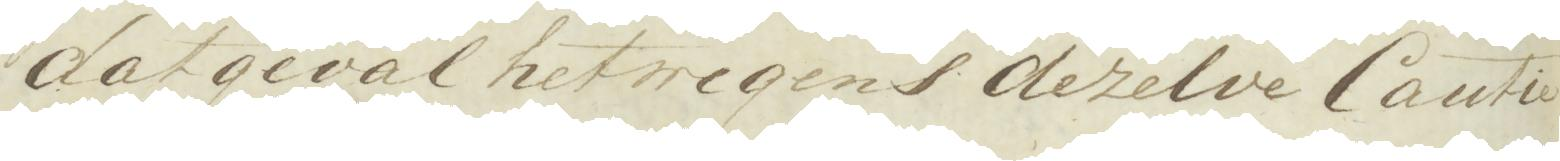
dat geval het wegens dezelve Cautie
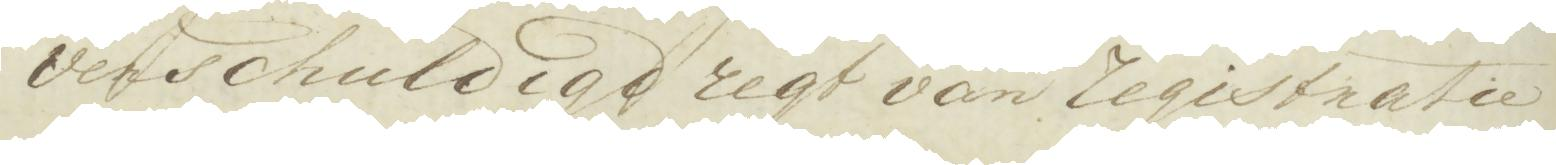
verschuldigd regt van registratie
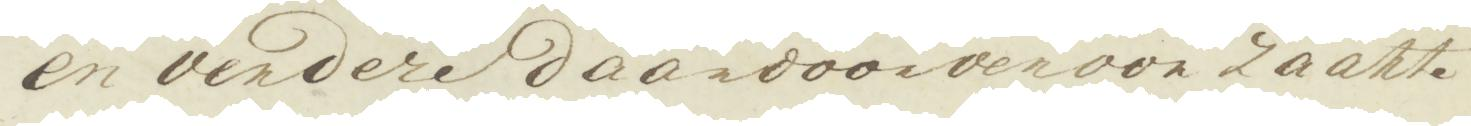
en verdere daardoor veroor zaakte
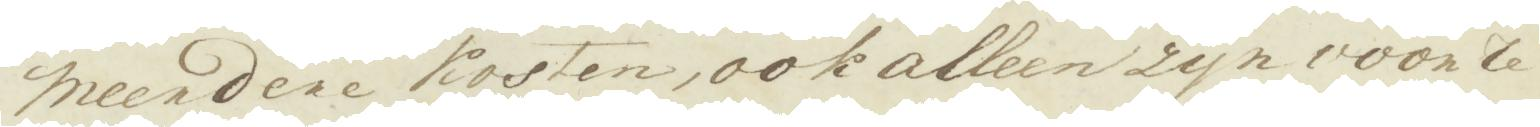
meerdere Kosten, ook alleen zijn voor te
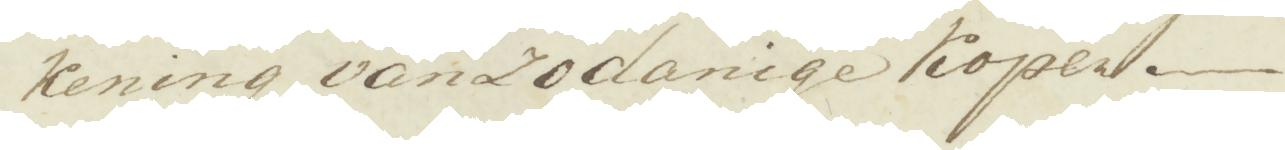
kening van zodanige Koper.
